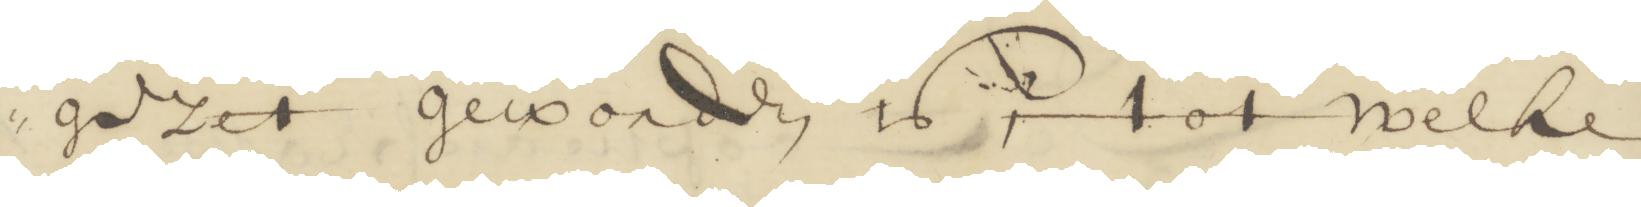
„gezet geworden is, tot welke
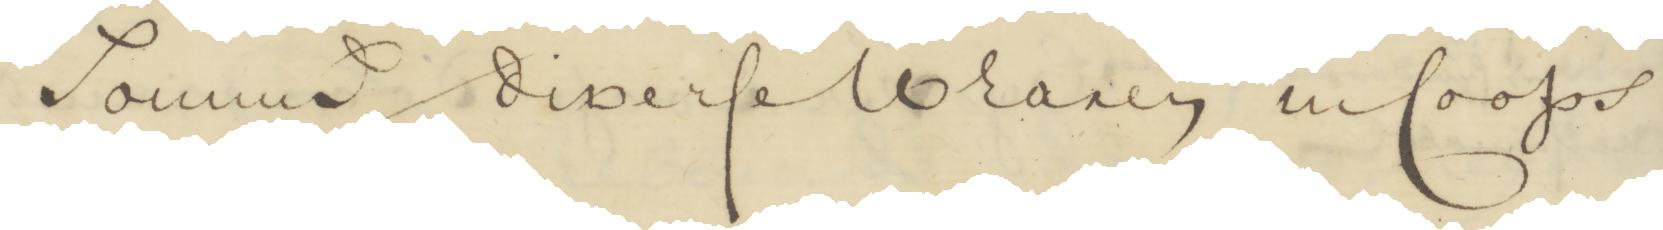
somme diverse wharen in Coops
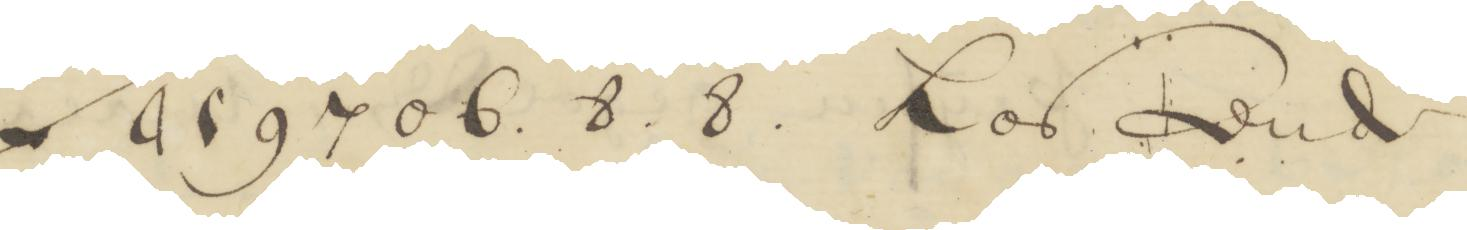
ƒ459706.8.8. kostende
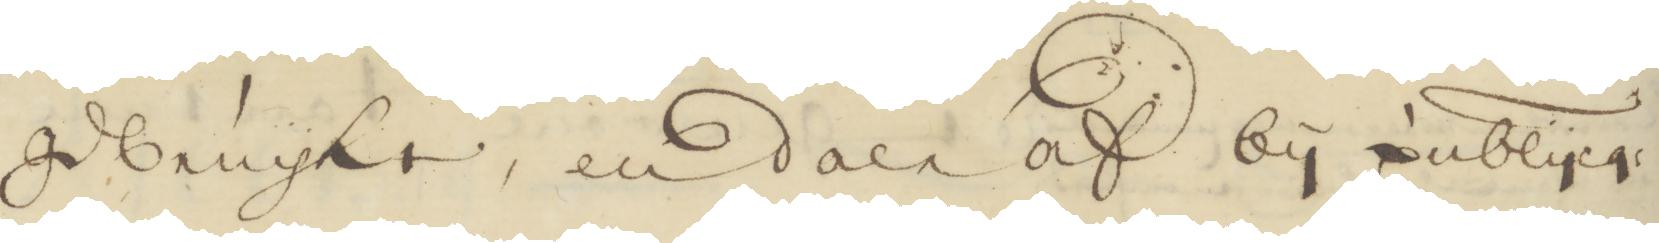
gebruijkt, en daer af bij publijcq:
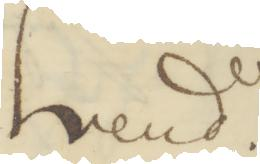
vend.e
